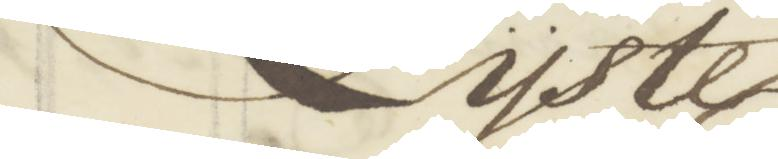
Lijste
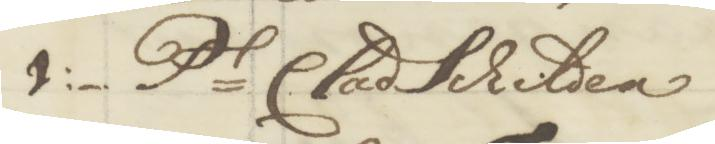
1:–. P=l Cladschilder
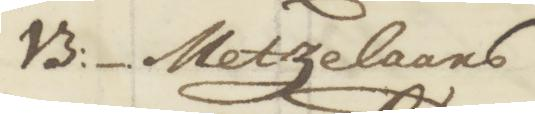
13: –. Metzelaars
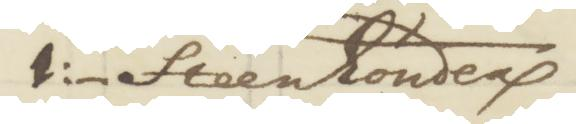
1:– steenhouder
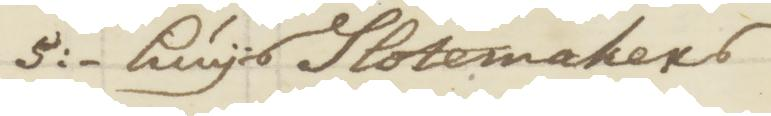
5: – huijs Slotemakers
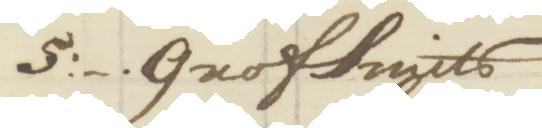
5:– . Grofsmits
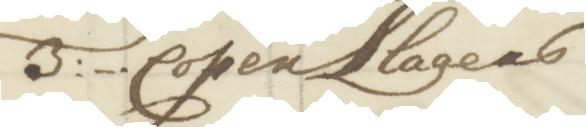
3:–. Coperslagers
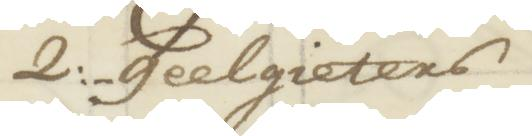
2:– geelgieters
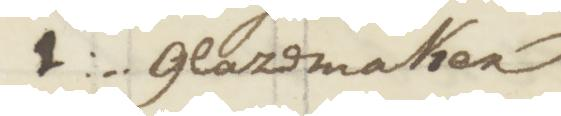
1:–. glazemaker
